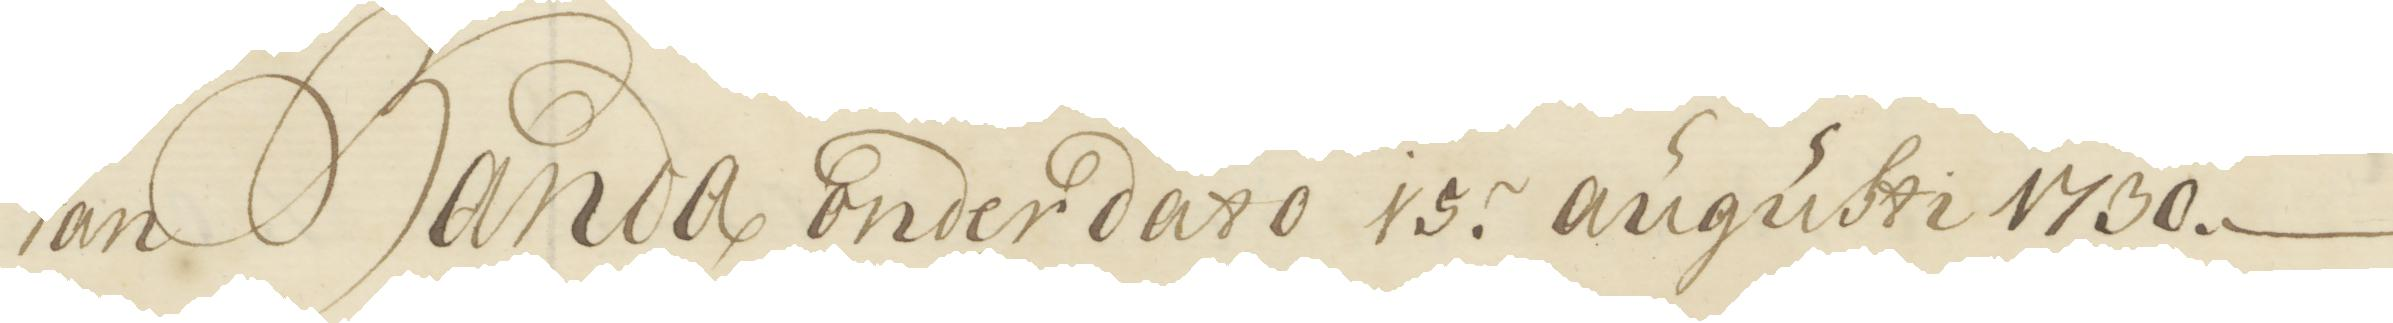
Van Banda onder dato 15.' augusti 1730.—
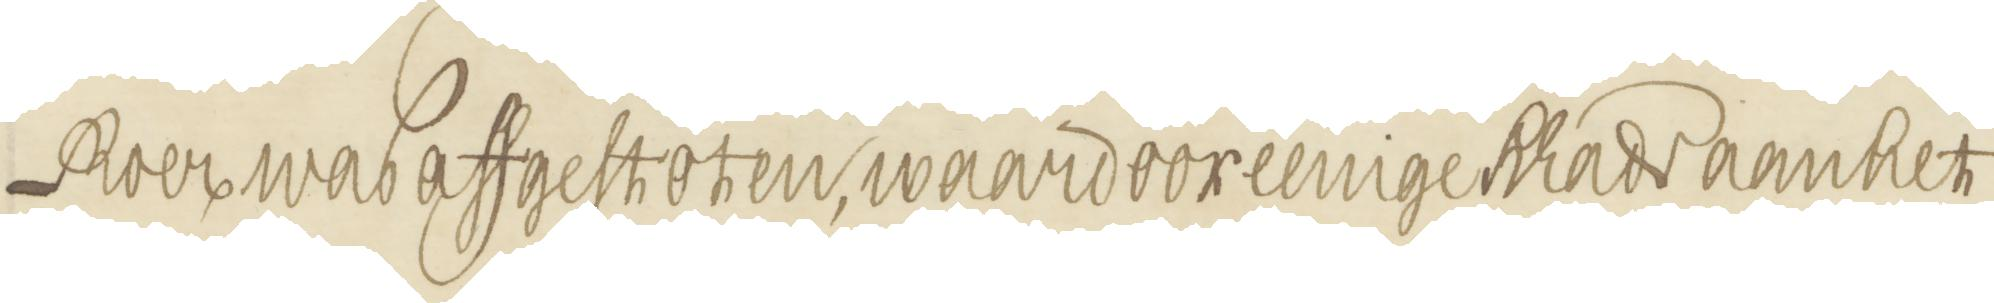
Roer was affgestoten, waardoor eenige schade aan het
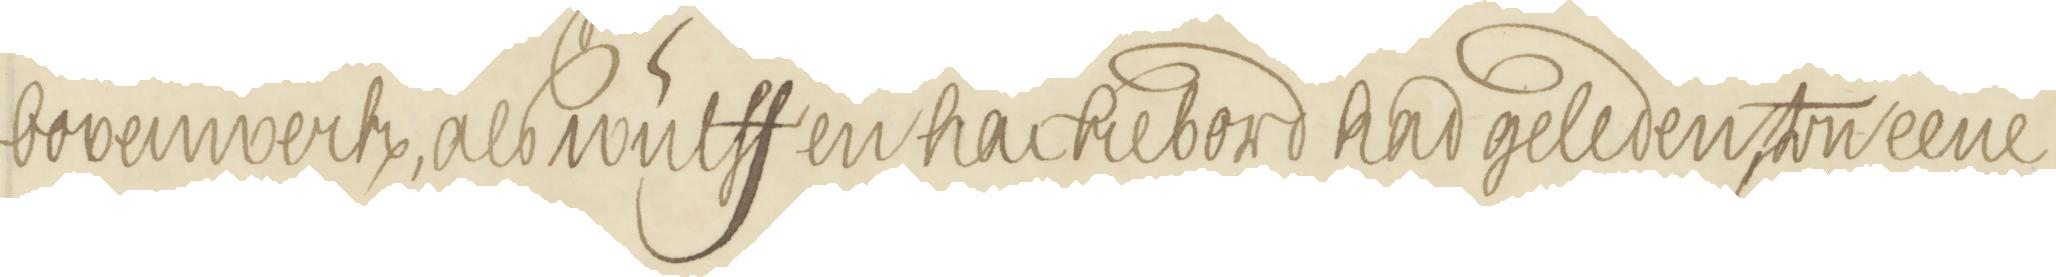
bovenwerk, als wulff en hackebord had geleden, ten eene
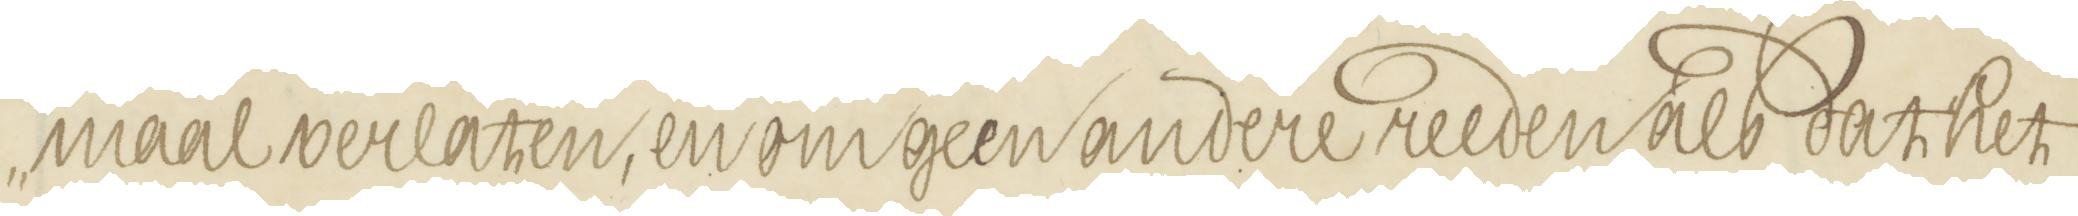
„maal verlaten, en om geen andere reeden, als dat het
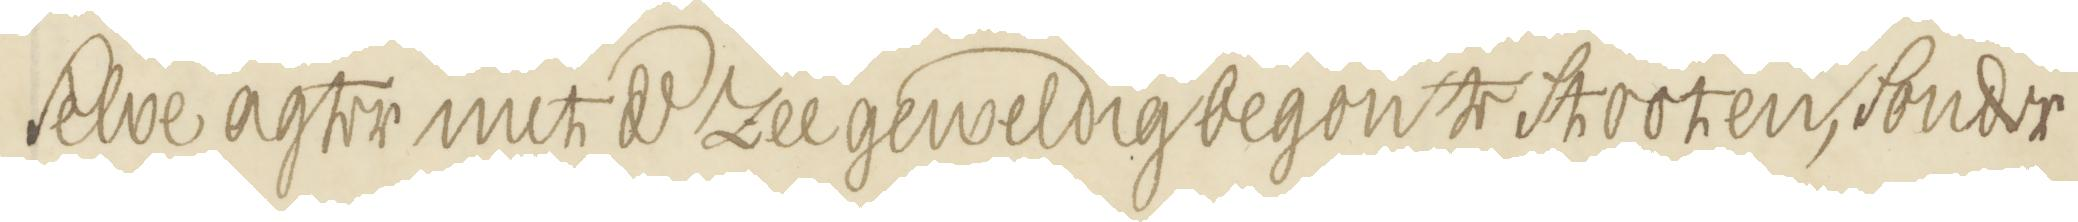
selve agter met de Zee geweldig begon te stooten, Sonder
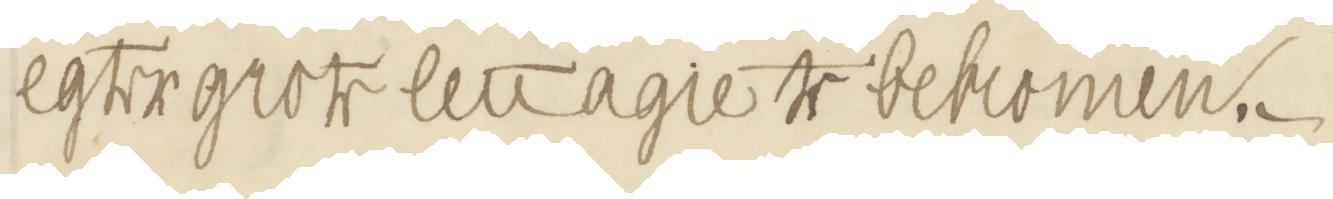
egter grote leccagie te bekomen.—
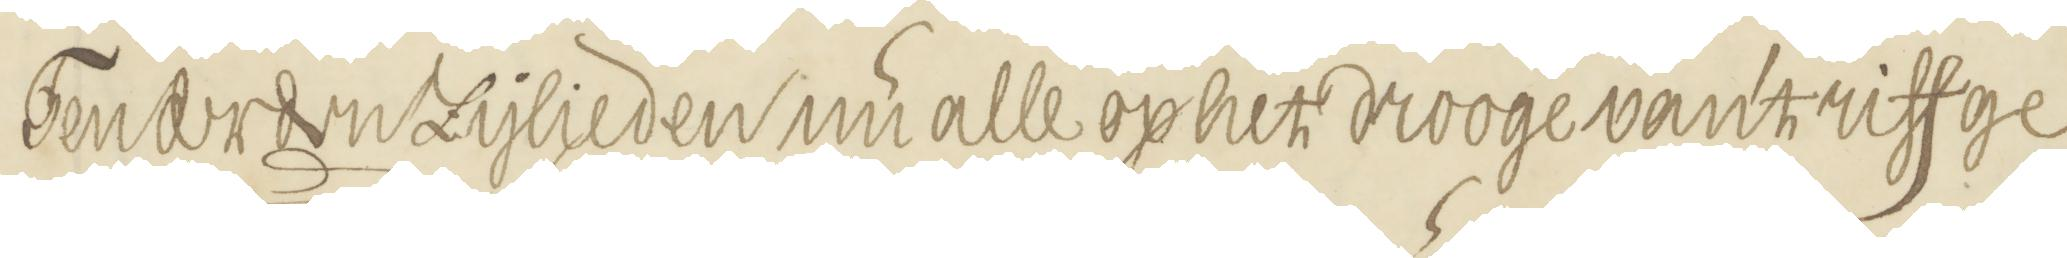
Ten derden Zijlieden nu alle op het drooge van 't riff ge
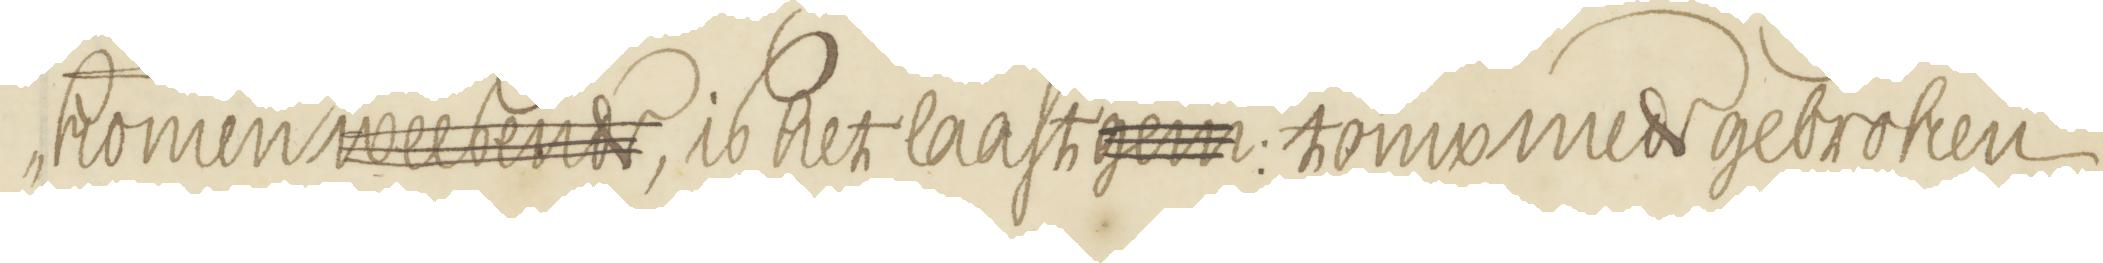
„komen weesende, is het laaste gem: touw mede gebroken
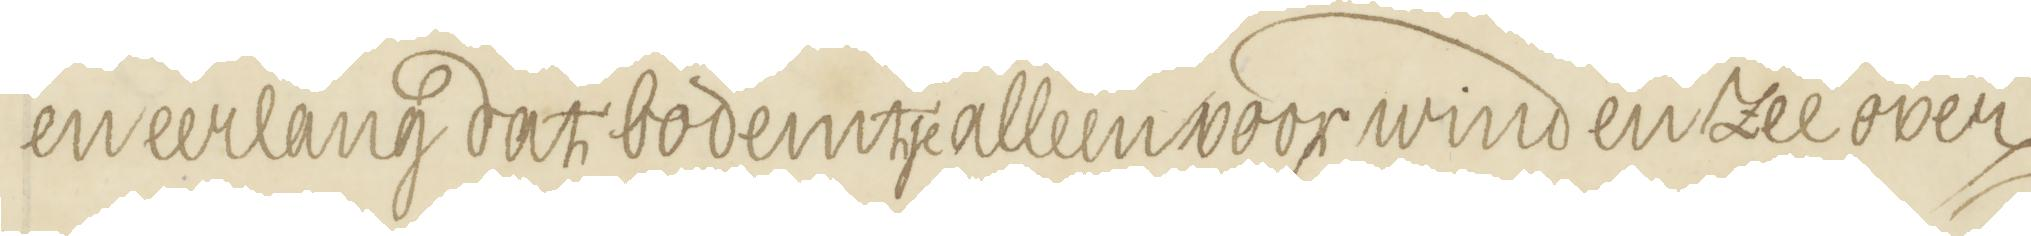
en eerlang dat bodemtje alleen voor wind en Zee over
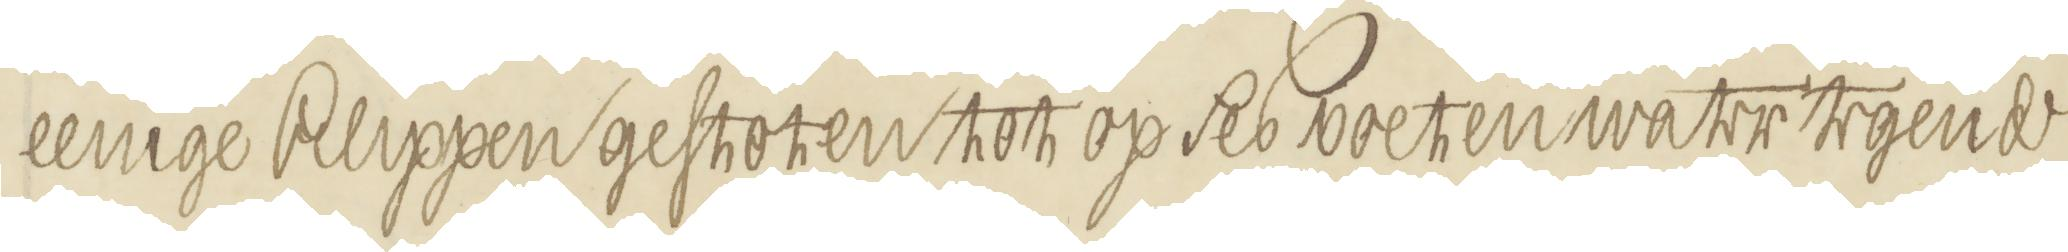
eenige klippen gestoten tot op ses voeten water tegen de
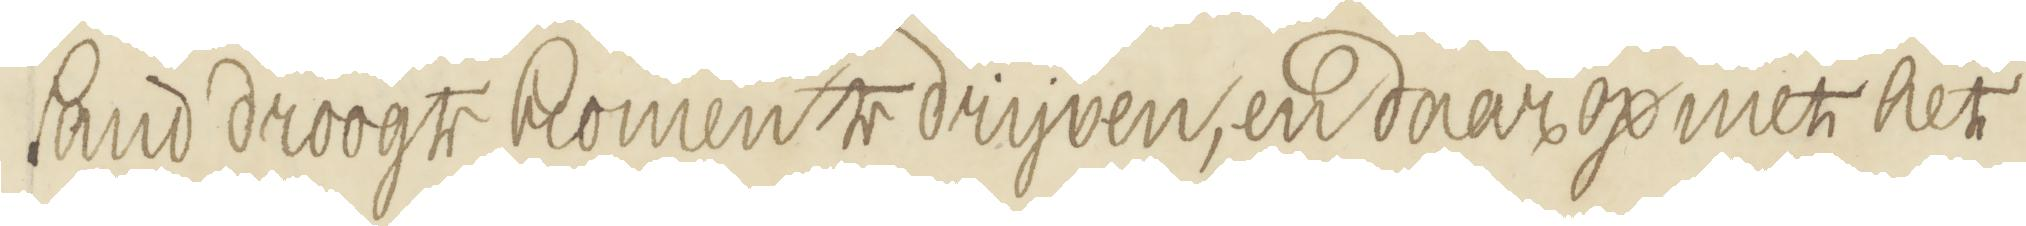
Sand droogte komen te drijven, en daar op met het
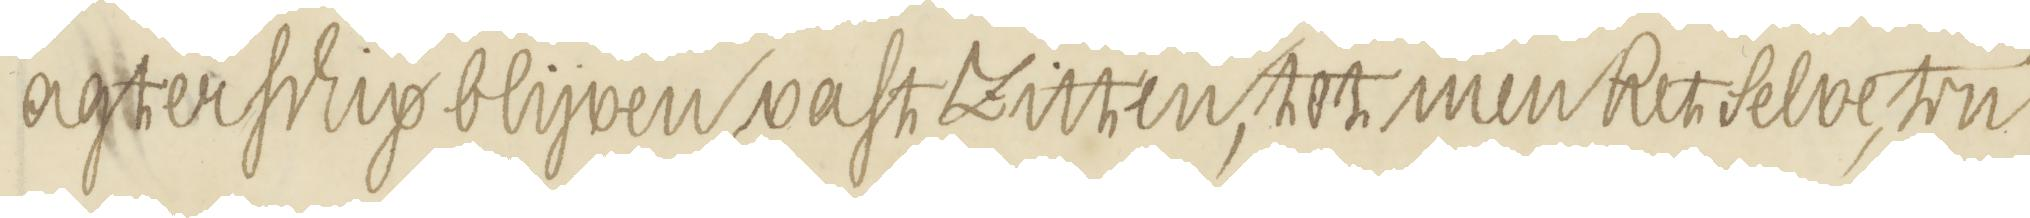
agterschip blijven vast Zitten, tot men het selve, ten
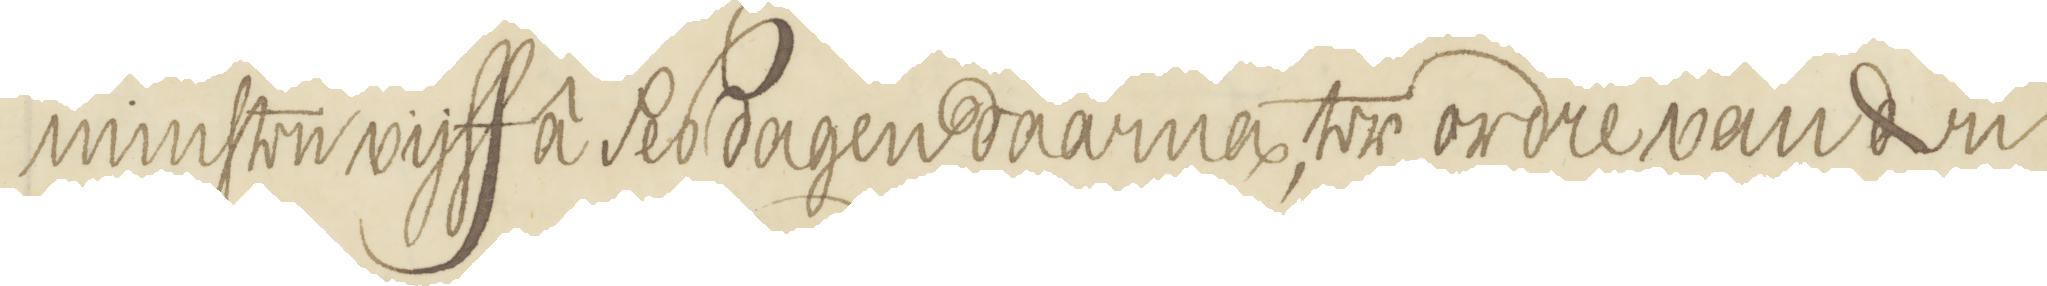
minsten vijff â ses dagen daarna, ter ordre van den
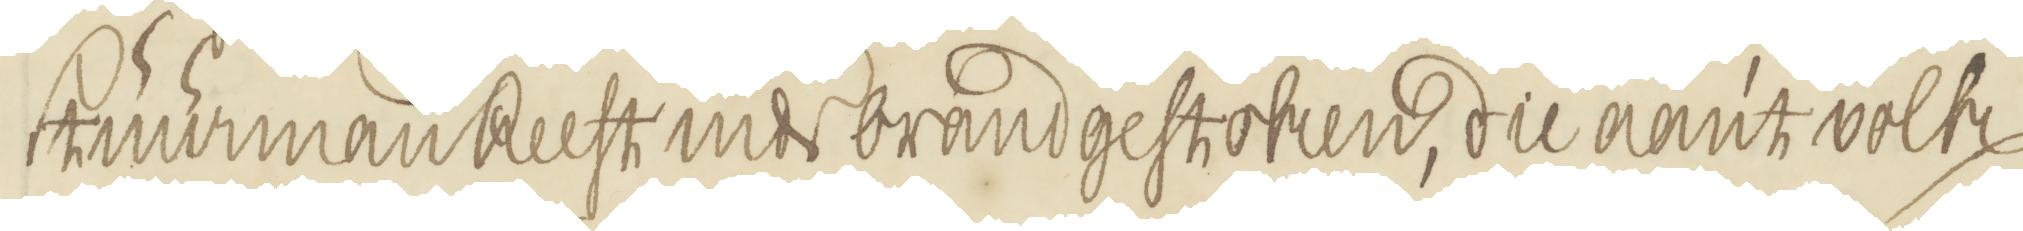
Stuurman heeft inde brandgestoken, die aan ’t volk
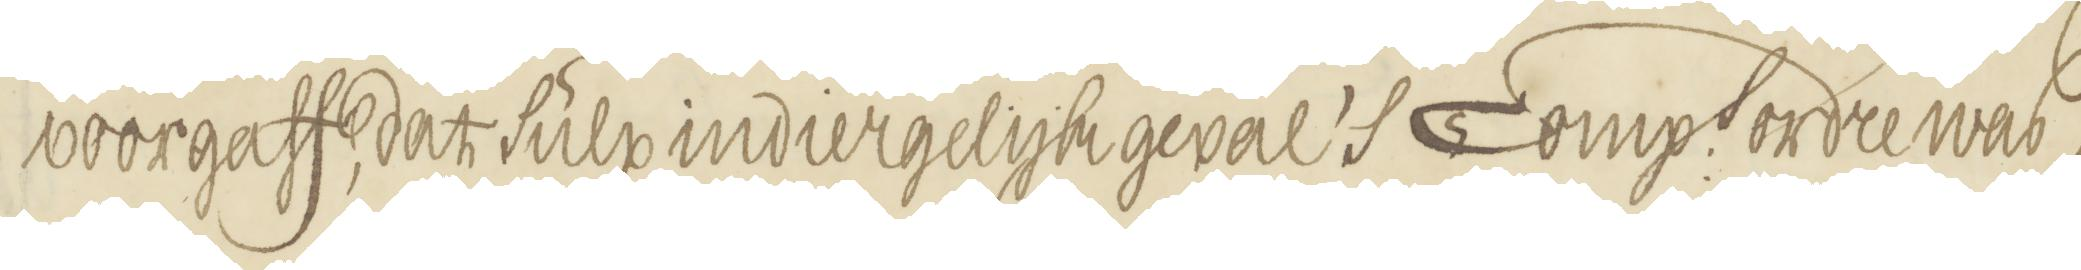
voorgaff, dat sulx in dier gelijk geval ’s Comp:s ordre was,
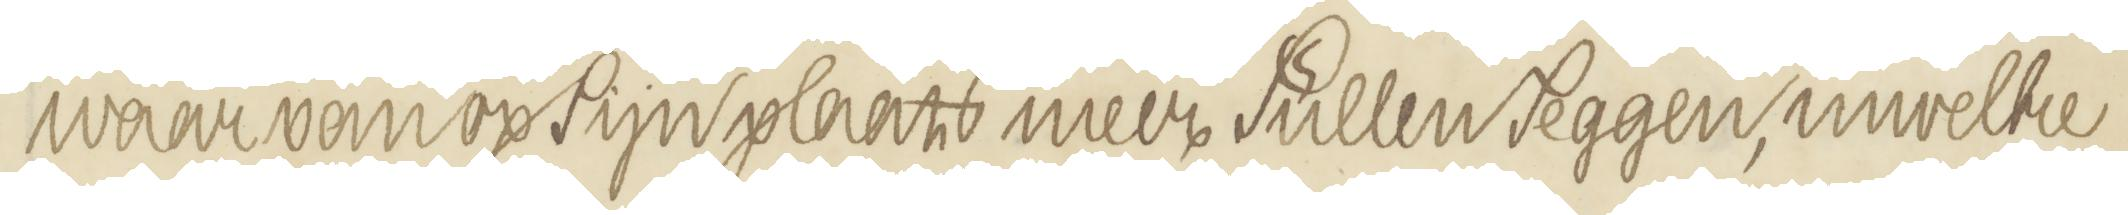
waar van op Sijn plaats meer Sullen Seggen, inwelke
